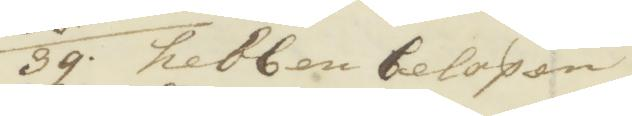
38./39. hebben belopen
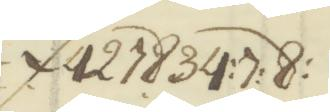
ƒ427834:7:8:
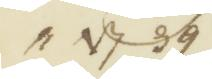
„ 17
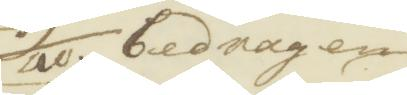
39/40. bedragen
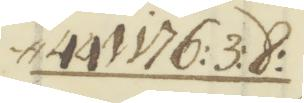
„441176:3:8:
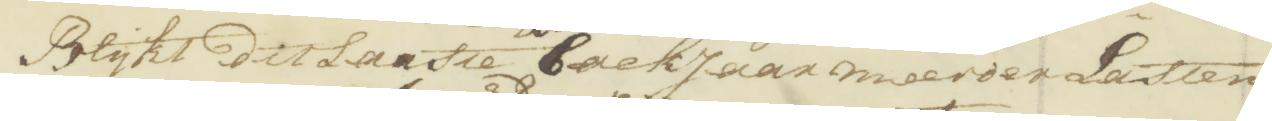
Blijkt dit Laaste boekjaar meerder Lasten
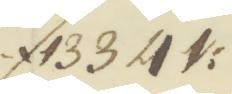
ƒ13341:
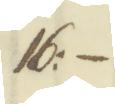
16: —
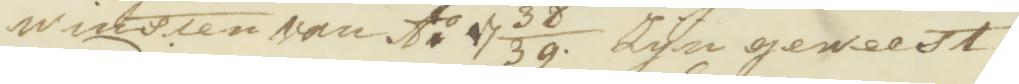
winsten van A„o 1738/39. zijn geweest.
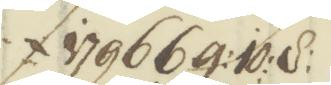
ƒ179669:10:8:
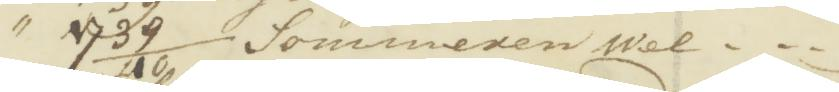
„ 1739/40 sommeren wel - - -
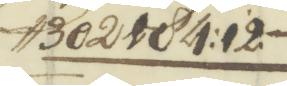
„302184:12
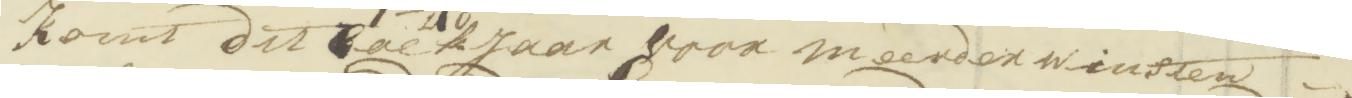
komt dit boek Jaar voor meerder winsten
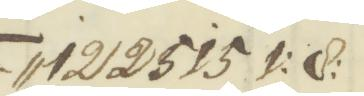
„1225151:8:
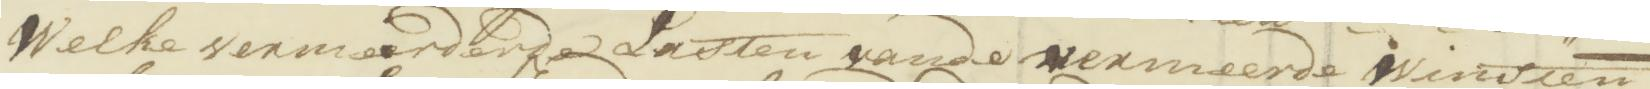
Welke vermeerderde Lasten vande vermeerde winsten
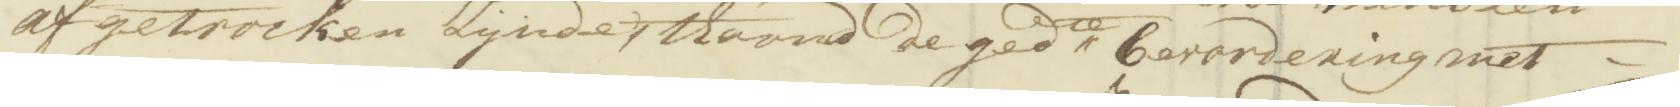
afgetrocken zijnde, thoond de ged„te bevordering met —
